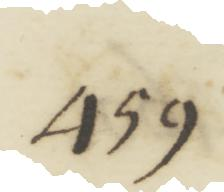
459
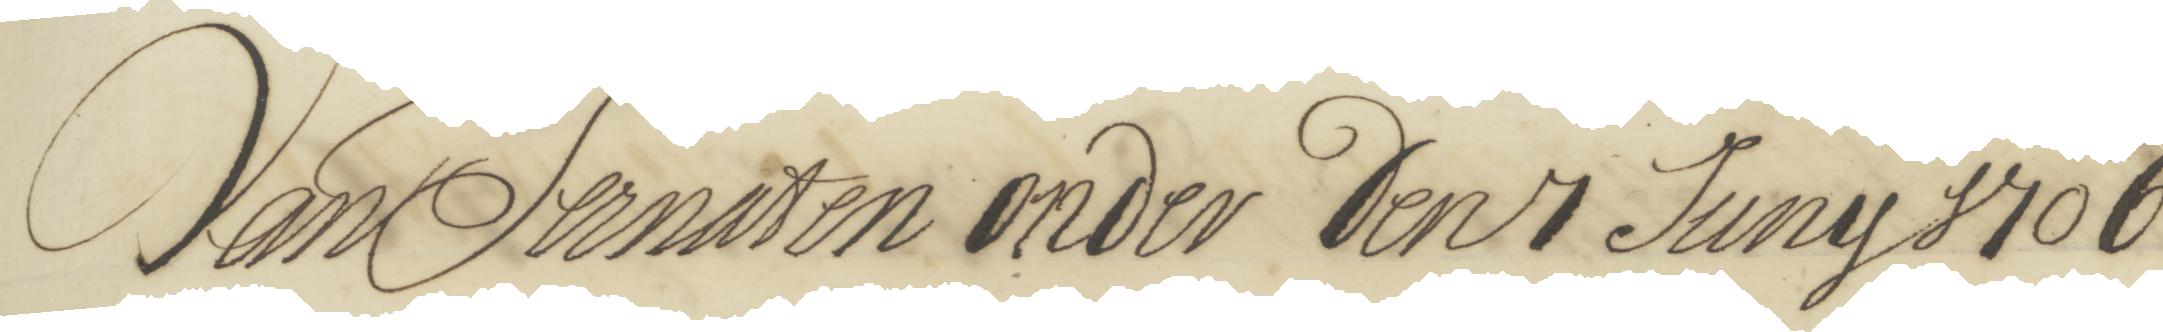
Van Ternaten onder den 7 Iunij 1706
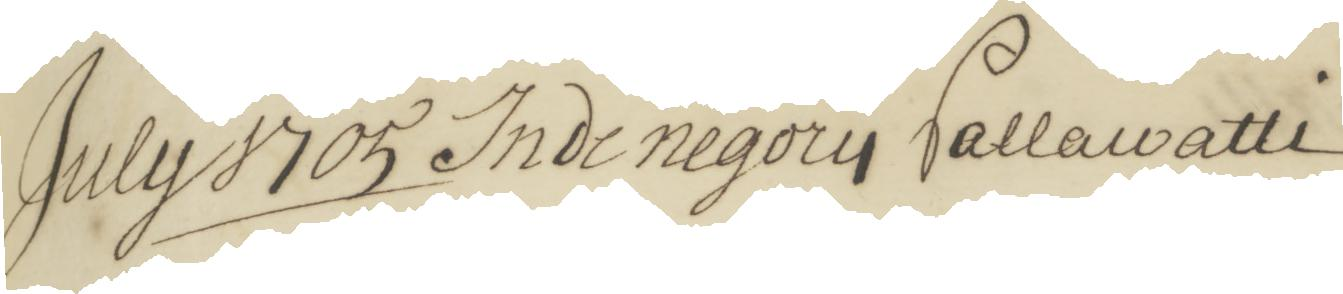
July 1705 In de negory sallawatti
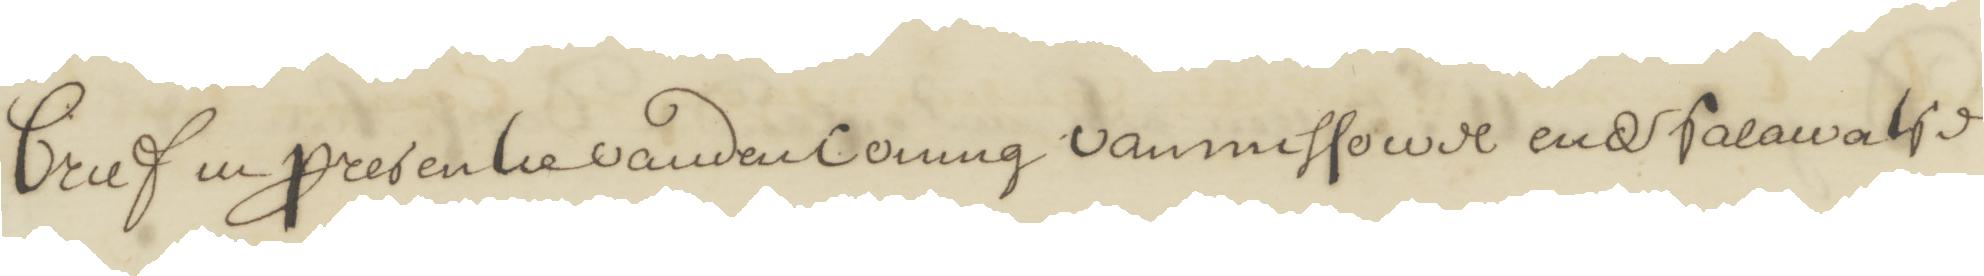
Brief in presentie van den Coning van missowel ende salawatse
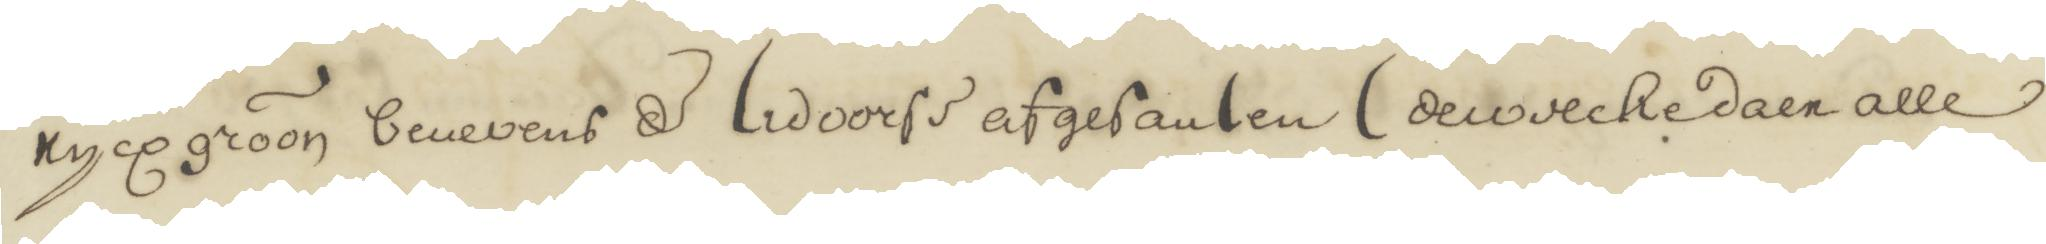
rycx groon benevens de tidoorse afgesanten (de welcke daer alle
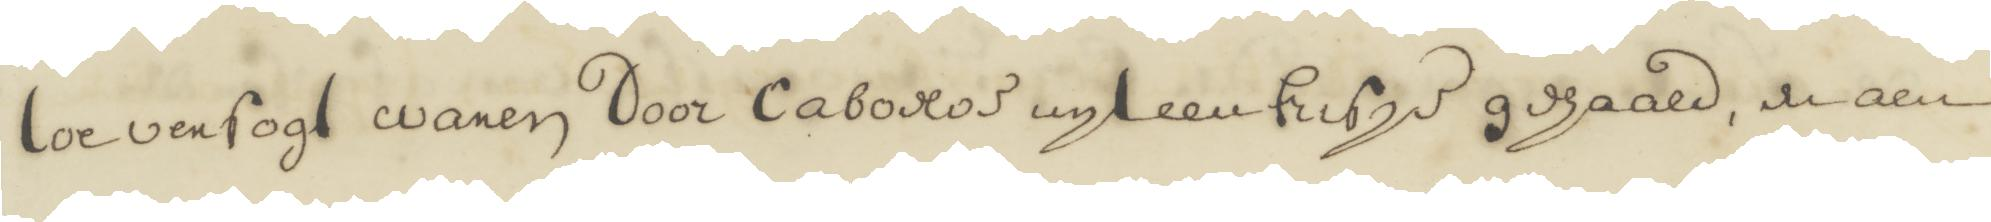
toe versogt waren door Caboeloe uyt een kisje gehaald, en aen
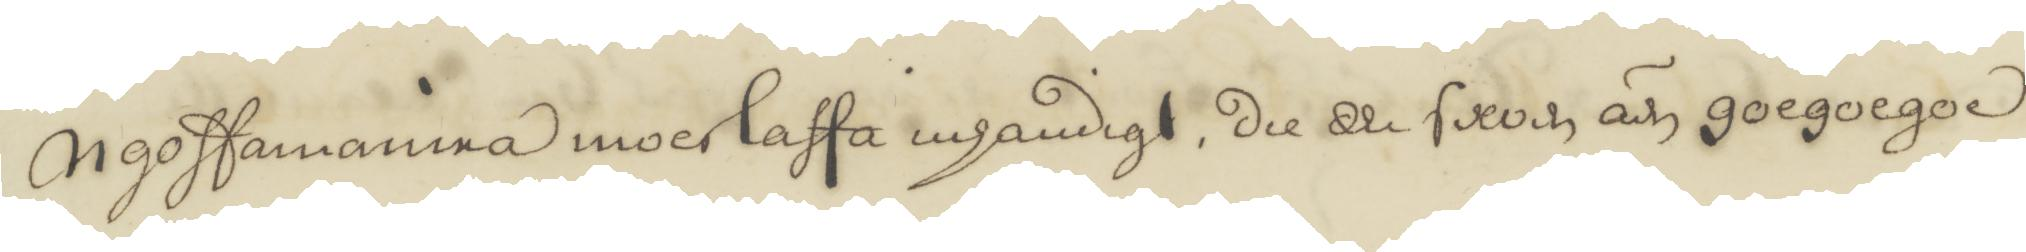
ngoffamanira moestaffa inhandigt, die den selven aen goegoegoe
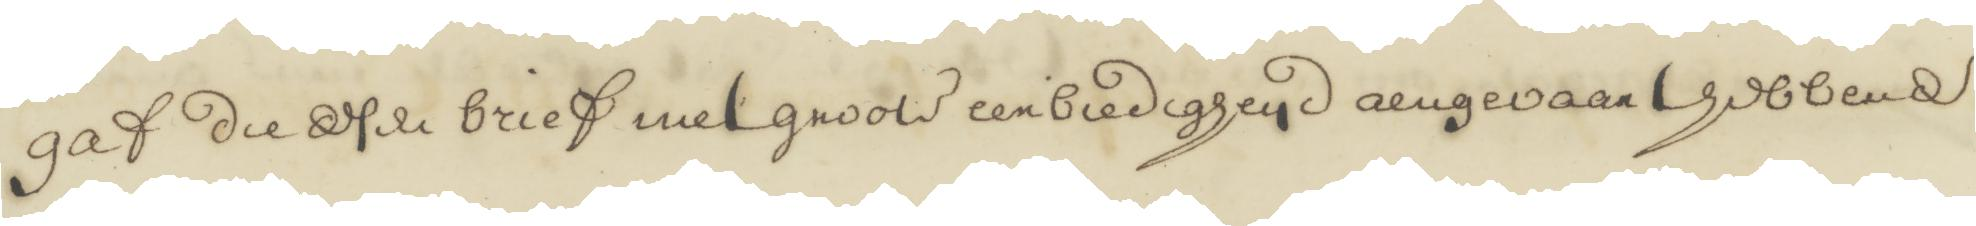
gaf die desen brief met groote eerbiedigheyd aengevaart hebbende
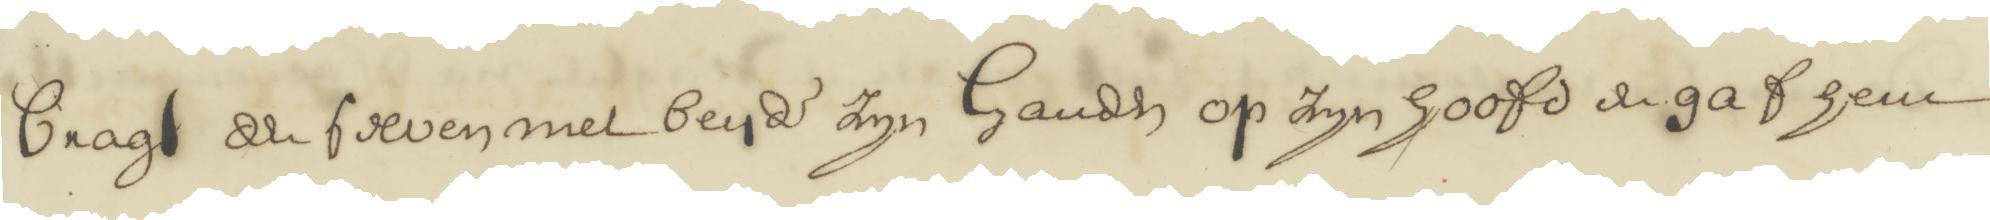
bragt den selven met beyde zyn handen op zyn hoofd en gaf hem
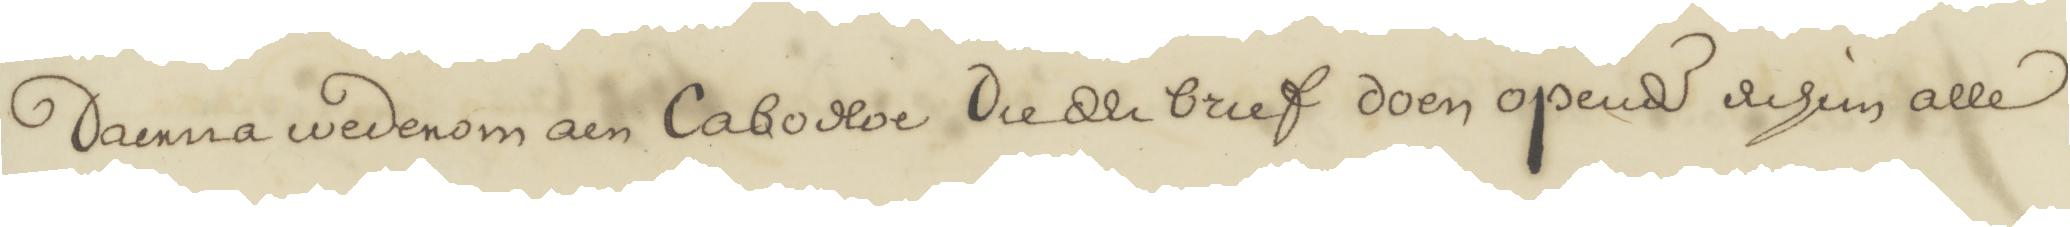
daerna wederom aen Caboeloe die den brief doen opende en hun alle
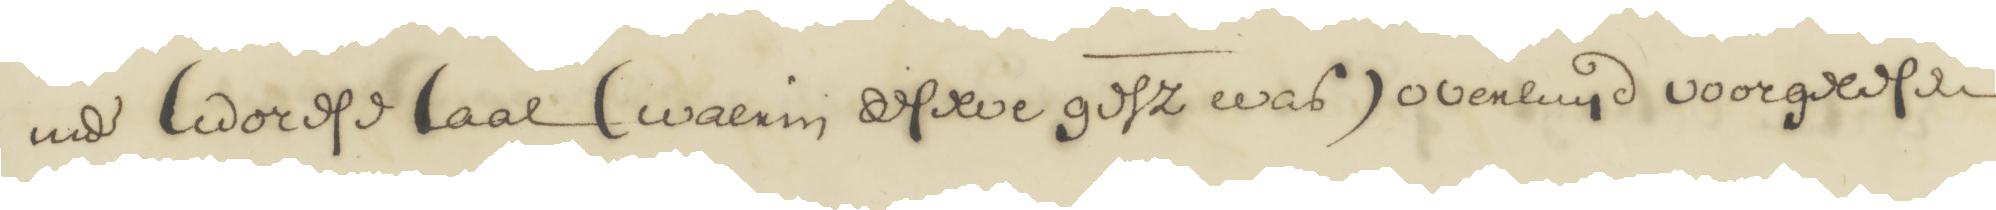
inde tidorese taal (waerin deselve gesz was) overluyd voorgelesen
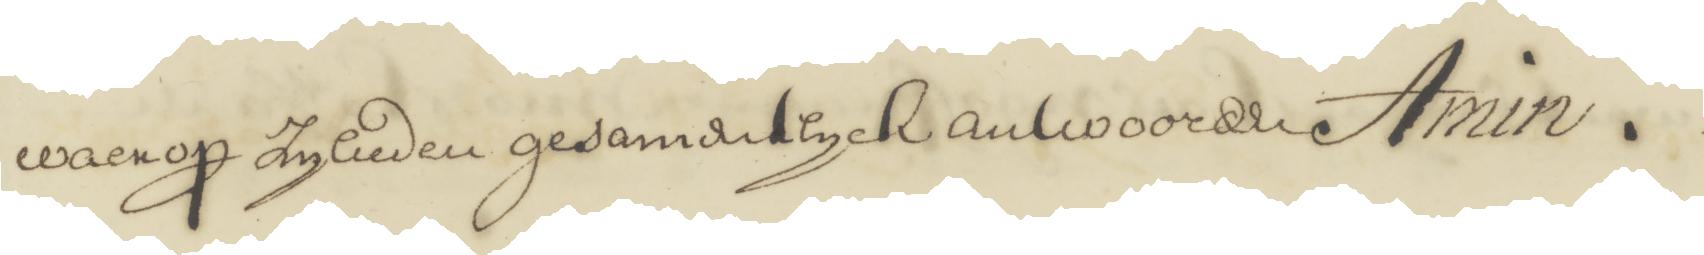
waerop zylieden gesamentlyck antwoorden Amin.
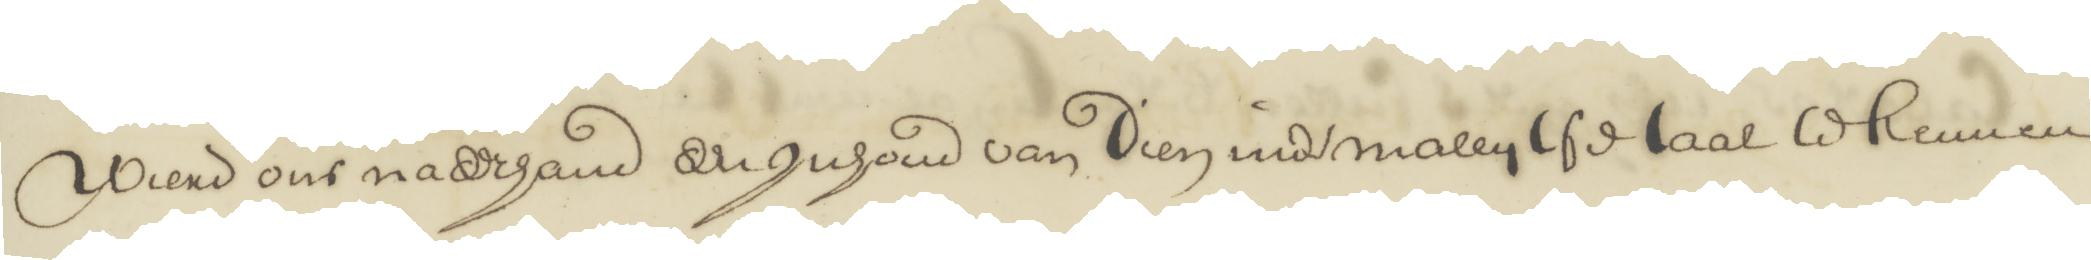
Wierd ons naderhand den jnhoud van Dien inde maleytse taal te kennen
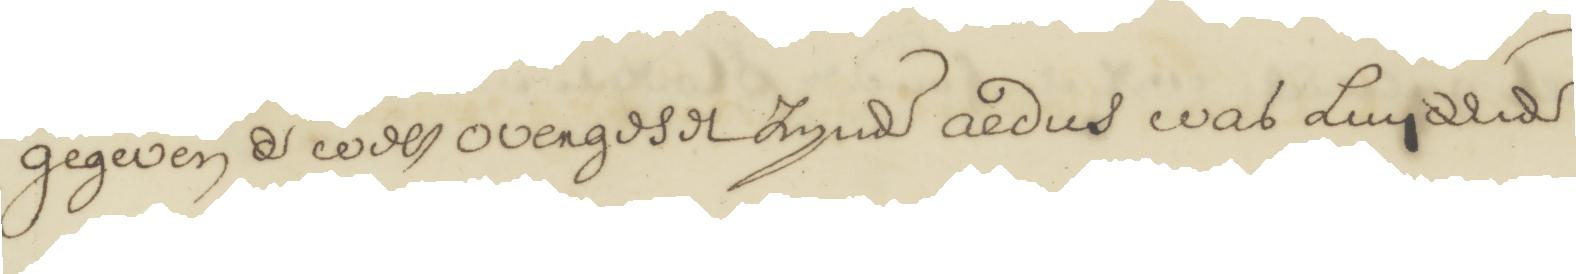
gegeven de welijk overgeset zynde aldus was Luydende
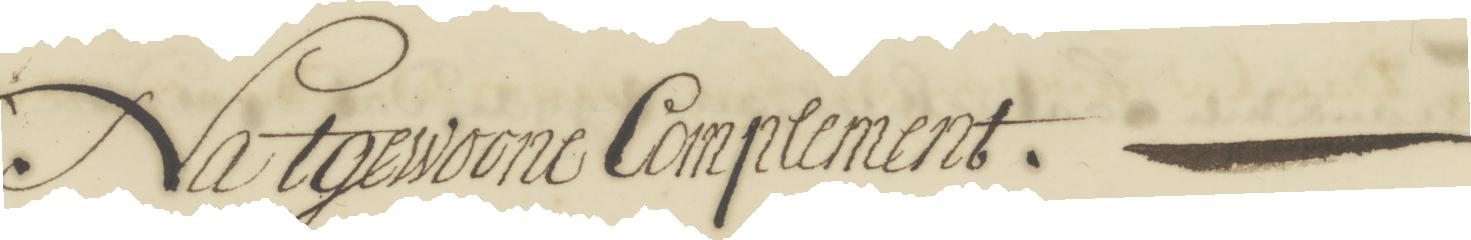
Na tgewoone Complement.
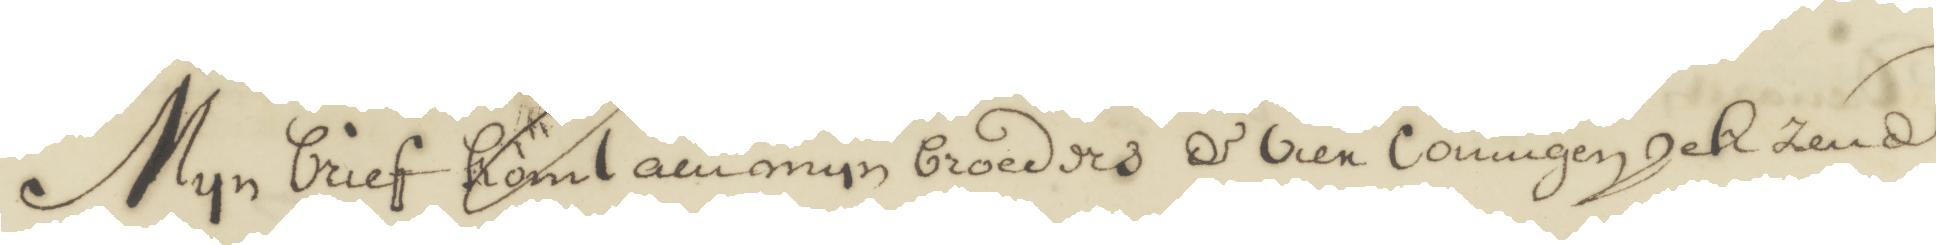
Myn brief komt aen myn broeders de vier Coningen jck zende
